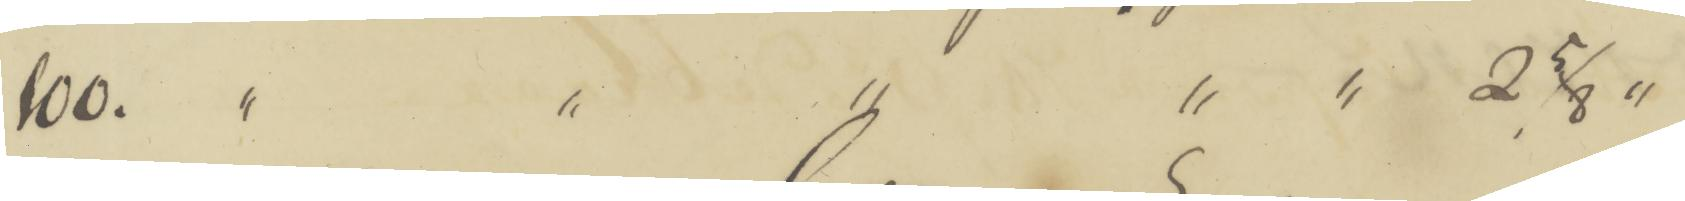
100. „ „ „ „ „ 2 5/8 „
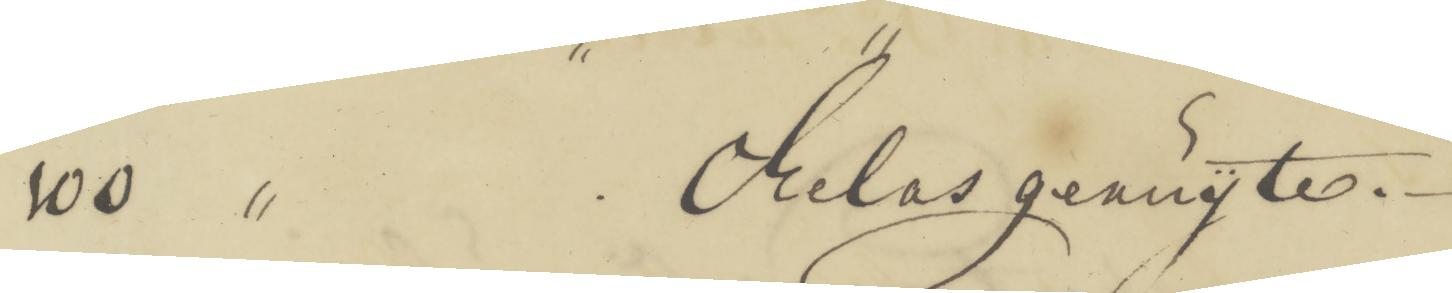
100 „ Chelas geruijte.
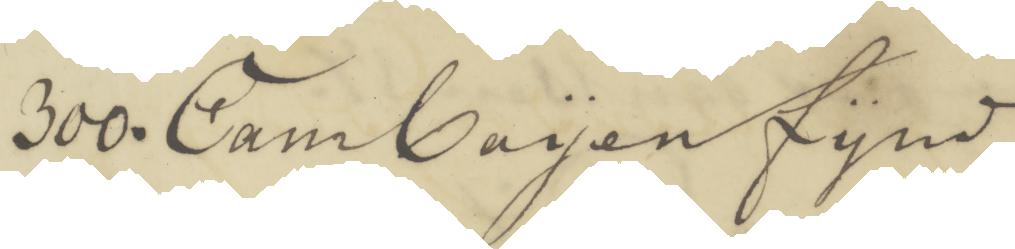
300. Cambaijen fijne
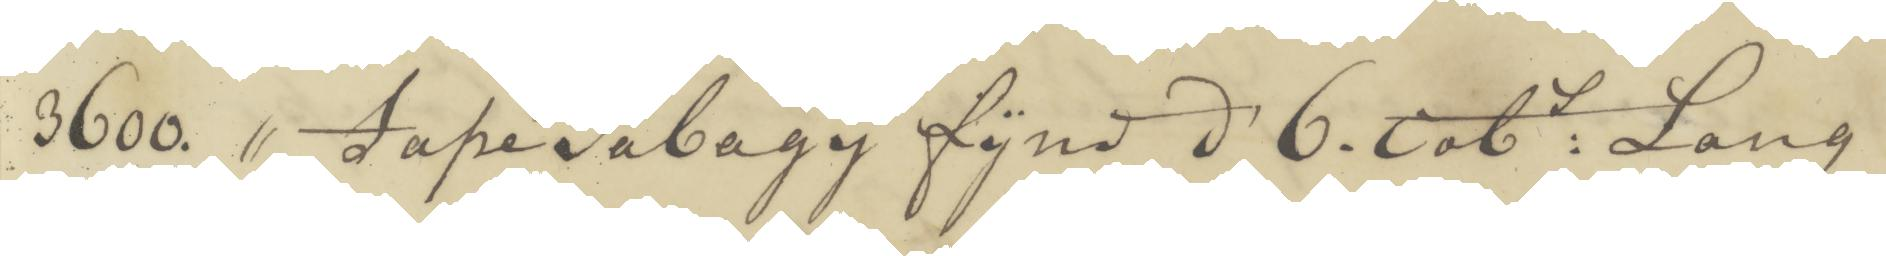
3600. „ tape Sabagij fijne d’ 6. cob:s Lang
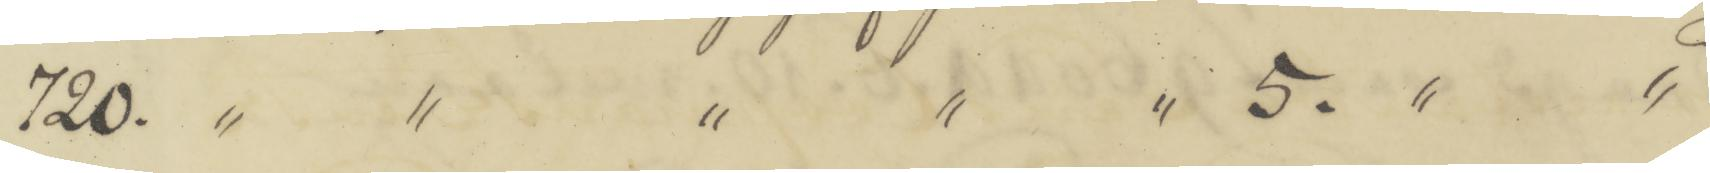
720. „ „ „ „ „ 5. „ „
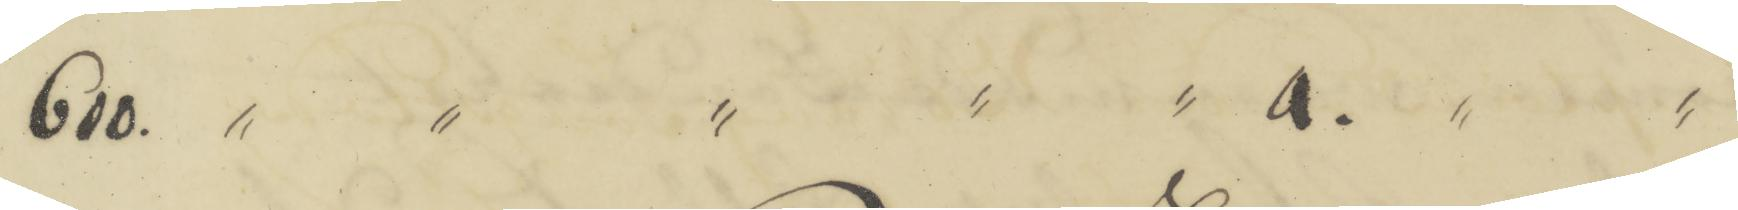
600. „ „ „ „ „ 4. „ „
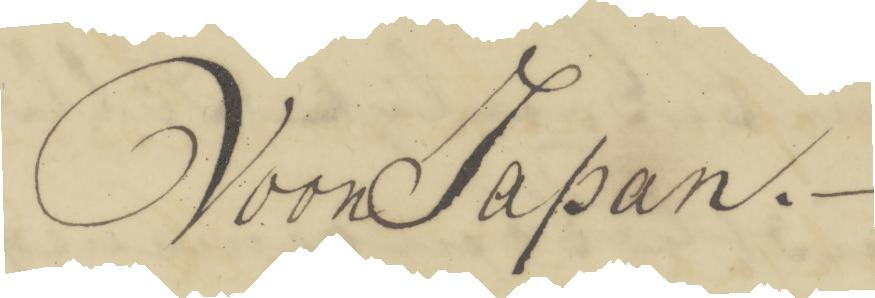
Voor Iapan.
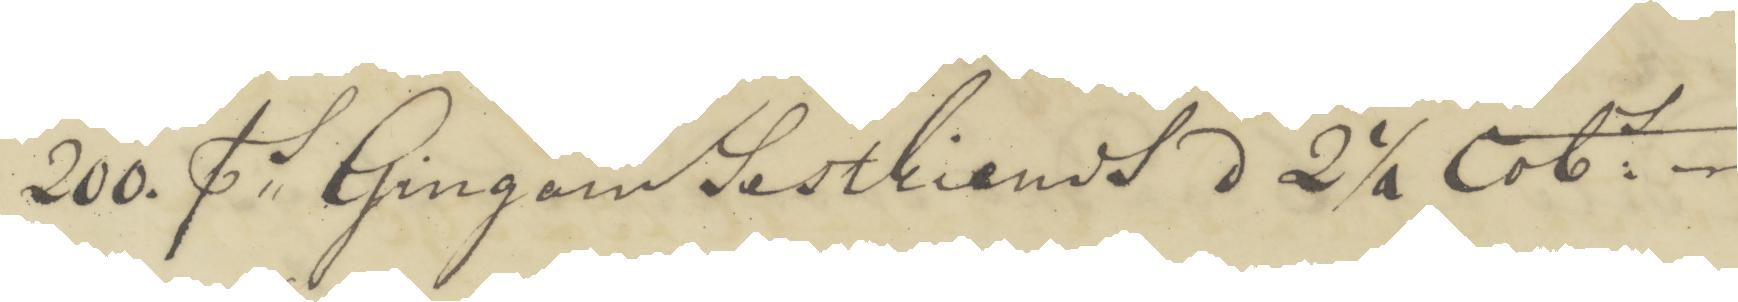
200. p„s Gingam Sesthienes d 2¼ Cob:s
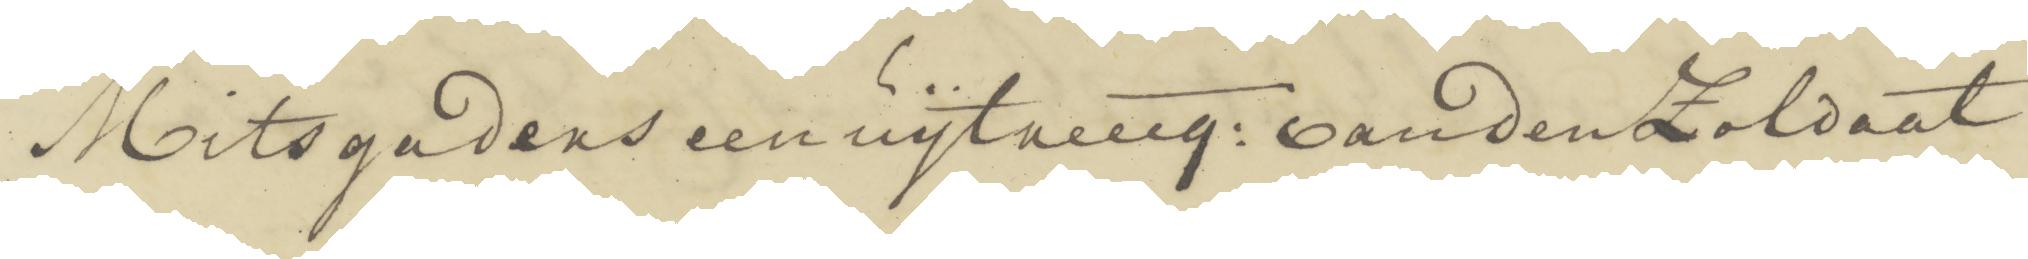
Mitsgaders een uijtreecq: van den Zoldaat
